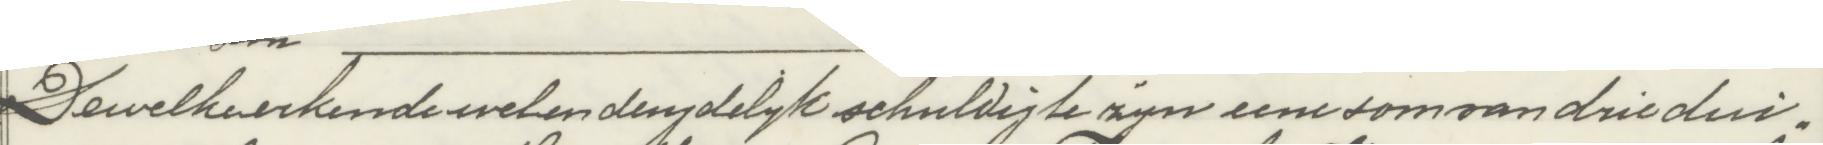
Dewelke erkende wel en deugdelyk schuldig te zijn eene som van drie dui„
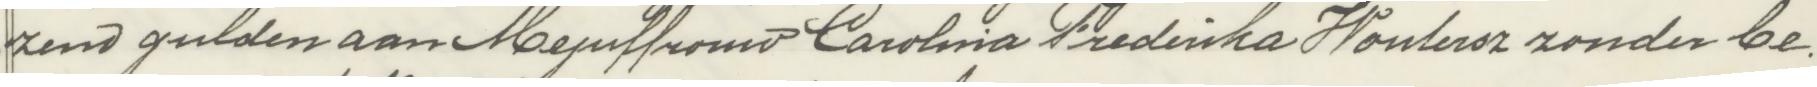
zend gulden aan Mejuffrouw Carolina Fredeika Woutersz zonder be.
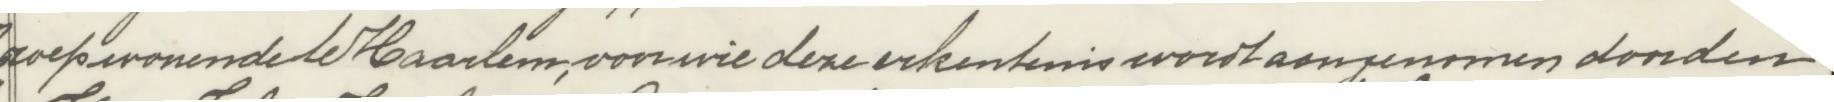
roep wonende te Haarlem, voor wie deze erkentenis wordt aangenomen door den
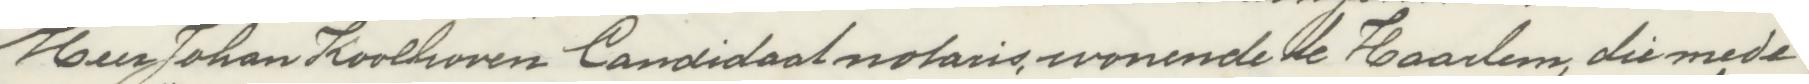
Heer Johan Koolhoven Candidaat notaris, wonende te Haarlem, die mede
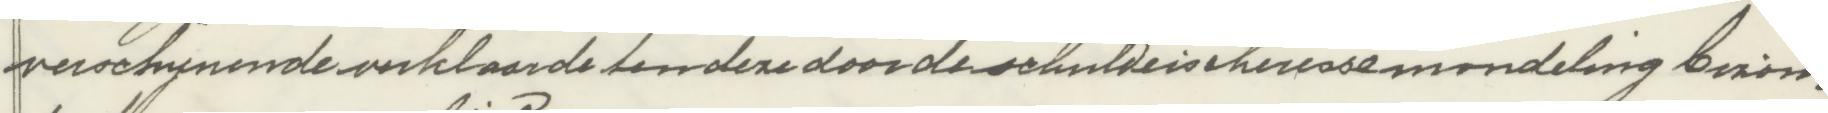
verschijnende verklaarde ten deze door de schuldeischeresse mondeling bizon„
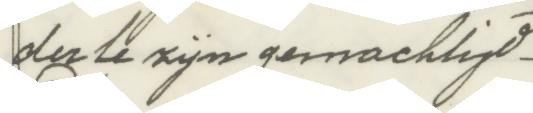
der te zijn gemachtigd-
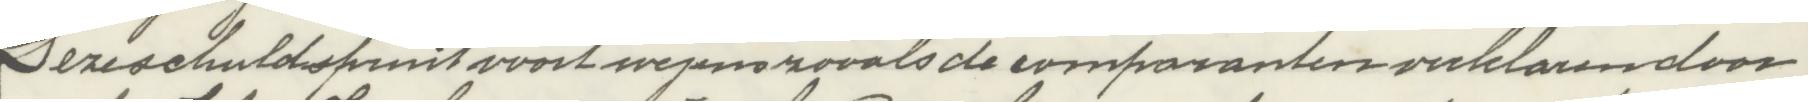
Deze schuld spruit voort wegens zooals de comparanten verklaren door
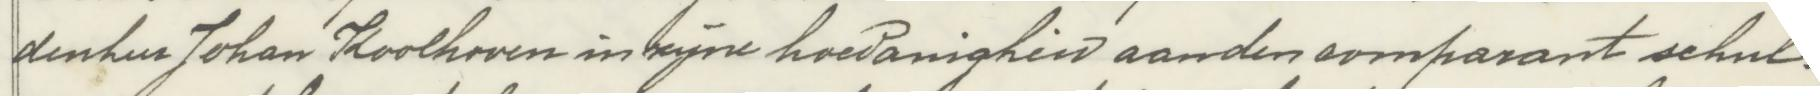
den heer Johan Koolhoven in zijne hoedanigheid aan den comparant schul„
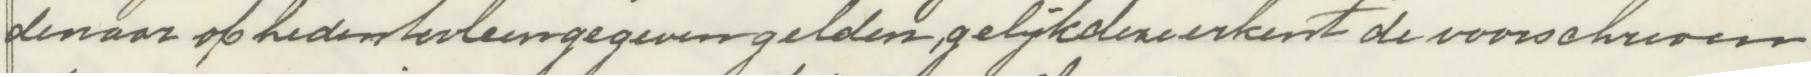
denaar op heden terleengegeven gelden, gelijk deze erkent de voorschreven
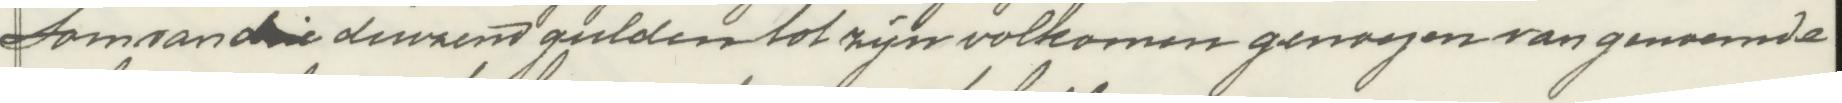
som van drie duizend gulden tot zijn volkomen genoegen van genoemde
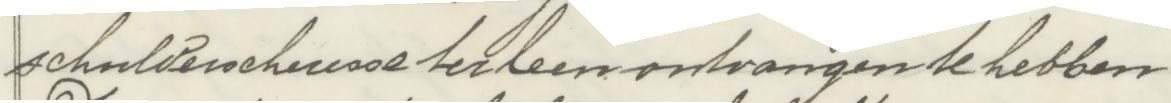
schuldeischeresse ter leen ontvangen te hebben
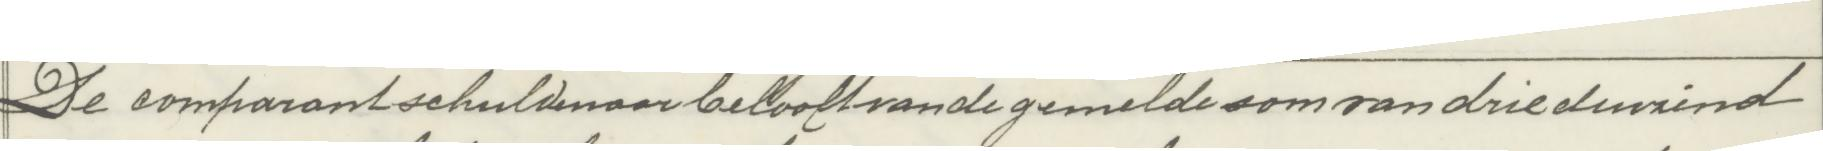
De comparant schuldenaar belooft van de gemelde som van drie duizend
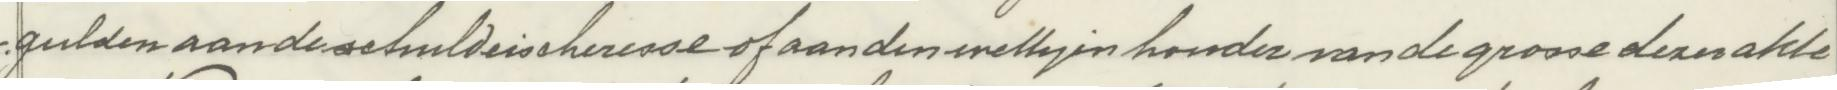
gulden aan de schuldeischeresse of aan den wettigen houder van de grosse dezer akte
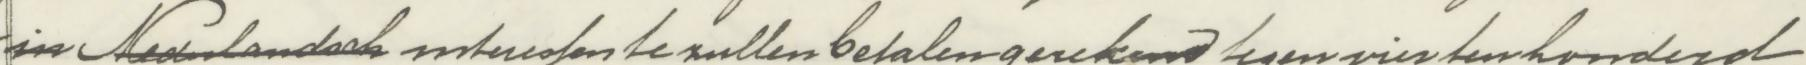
in Nederlandsch interessen te zullen betalen gerekend tegen vier ten honderd
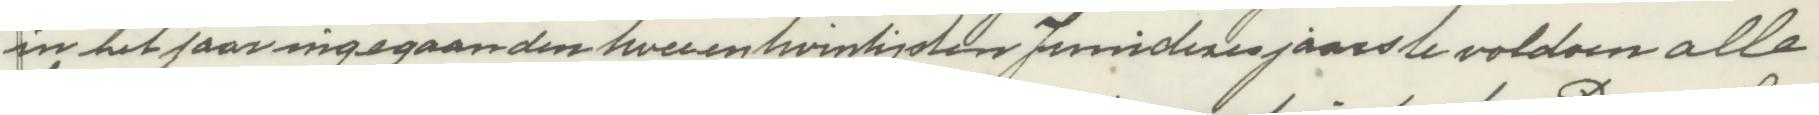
in het jaar ingegaan den twee en twintigsten Juni dezes jaars te voldoen alle
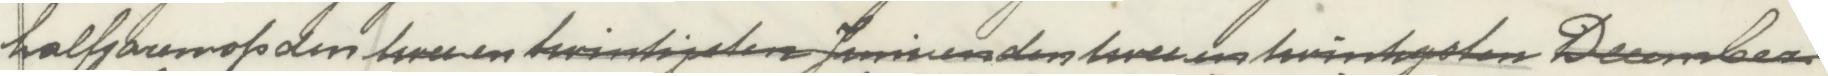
halfjaren op den |twee en twintigsten Juni en den twee en twintigsten December
